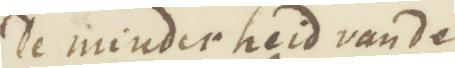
de minderheid van de
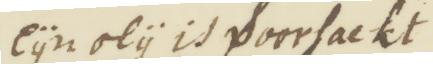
lijn olij is veroorsaekt
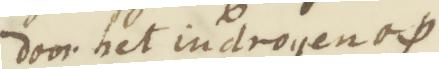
door het indrogen op
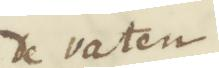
de vaten
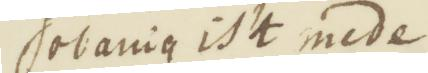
sodanig is ’t mede
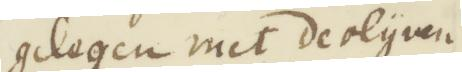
gelegen met de olijven
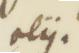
olij.
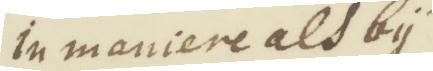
in maniere als bij
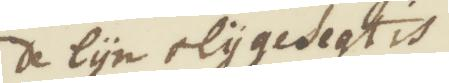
de lijn olij gesegt is
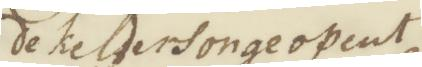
de kelders ongeopent
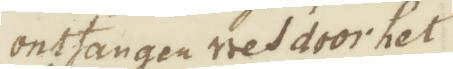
ontfangen wes door het
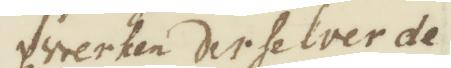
verwerken derselver de
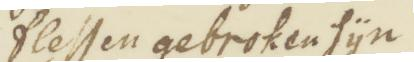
flessen gebroken sijn
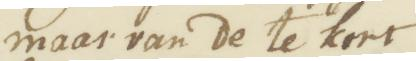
maar van de te kort
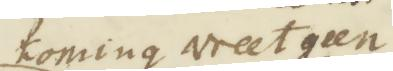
koming weet geen
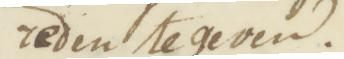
reden te geven.
